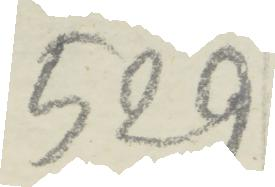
529
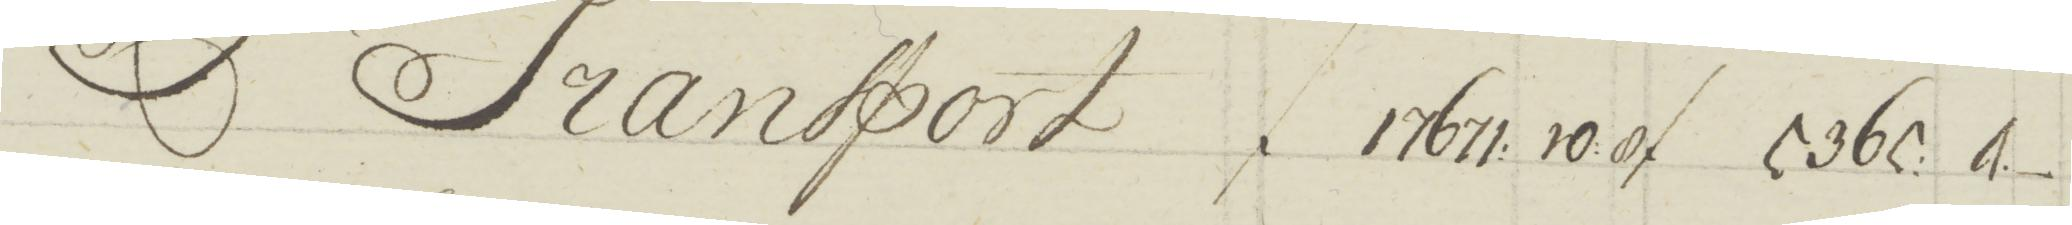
Pr Transport ƒ 17671:10:8ƒ 5365:4._
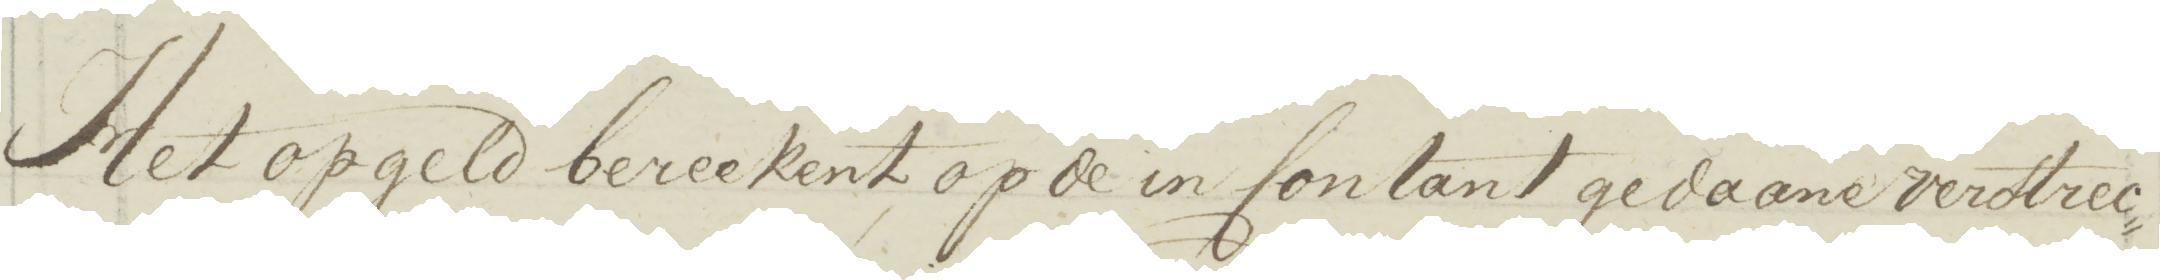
Het opgeld bereekent op de in Contant gedaane verstrec„
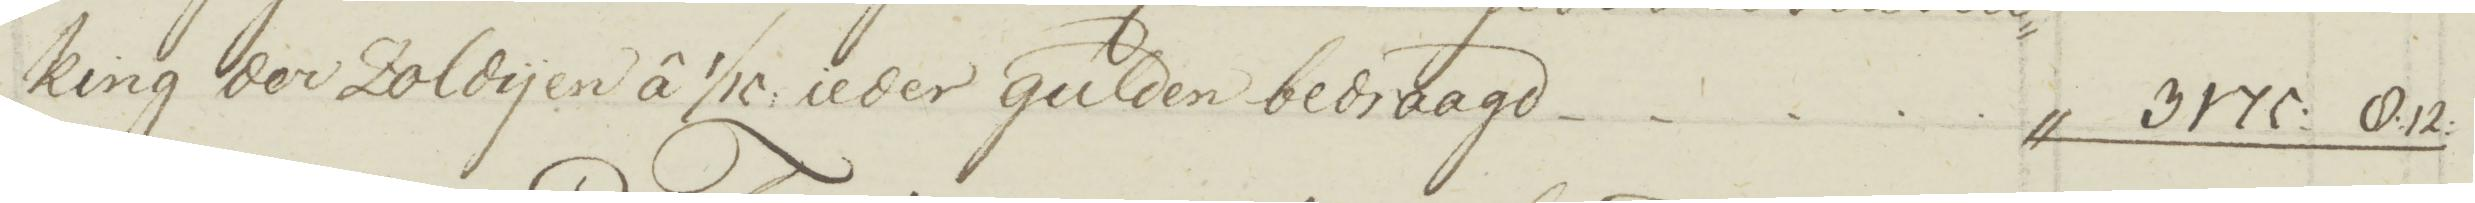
king der zoldijen â 1/15: ieder gulden bedraagd „ 3175: 8:12:
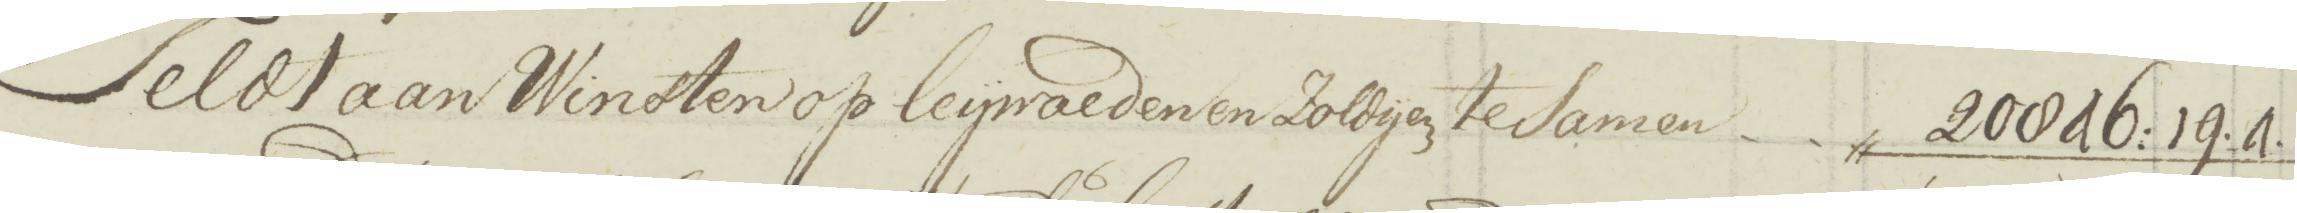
Teldt aan Winsten op leijwaeden en zoldijen te samen - - „ 20846:19.4.
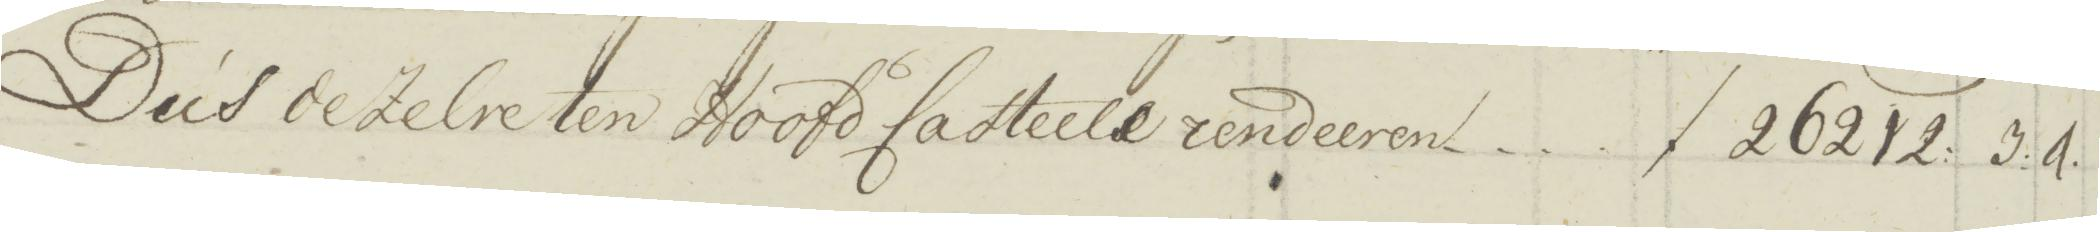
Dus dezelve ten Hoofds Casteele rendeeren - - . . ƒ 26212:3:4.
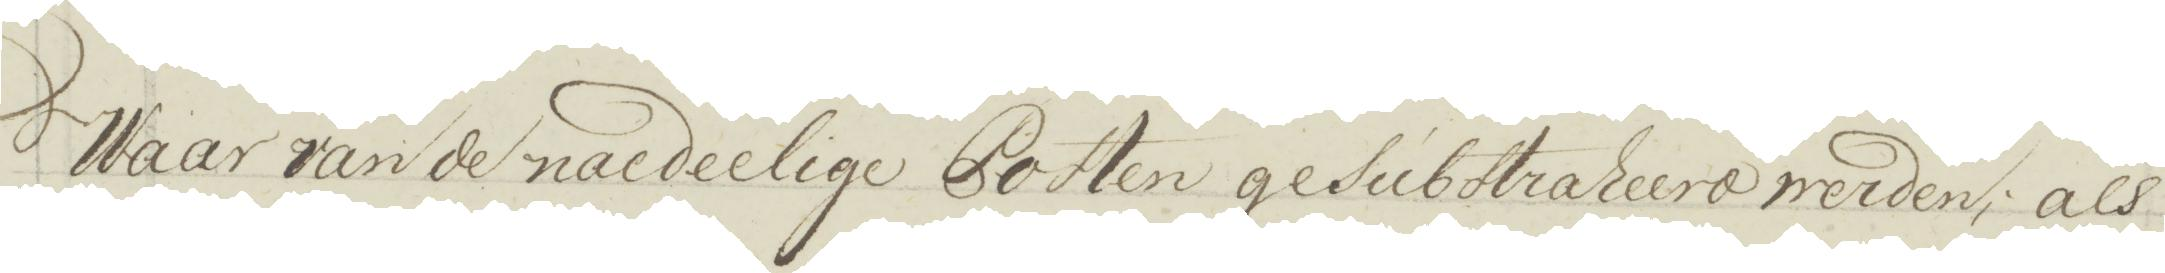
Waar van de naedeelige Posten gesubstraheerd werden; als
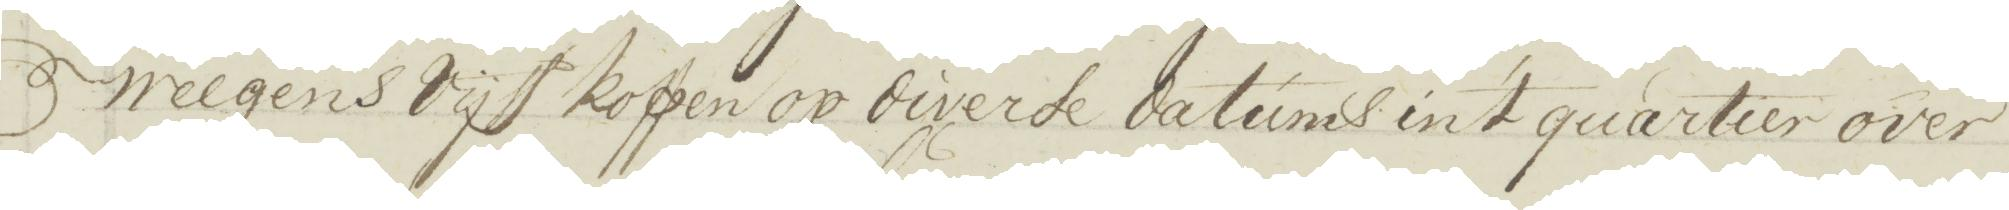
weegens vijf koppen op diverse datums in ’t quartier over
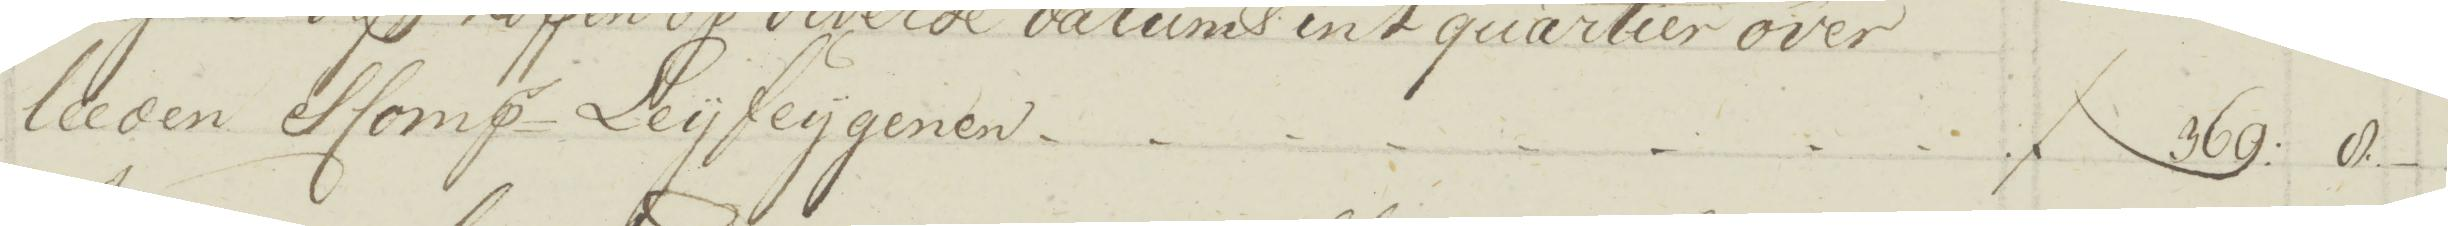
leeden ’s Comp=s Leijfeijgenen ƒ 369: 8:_
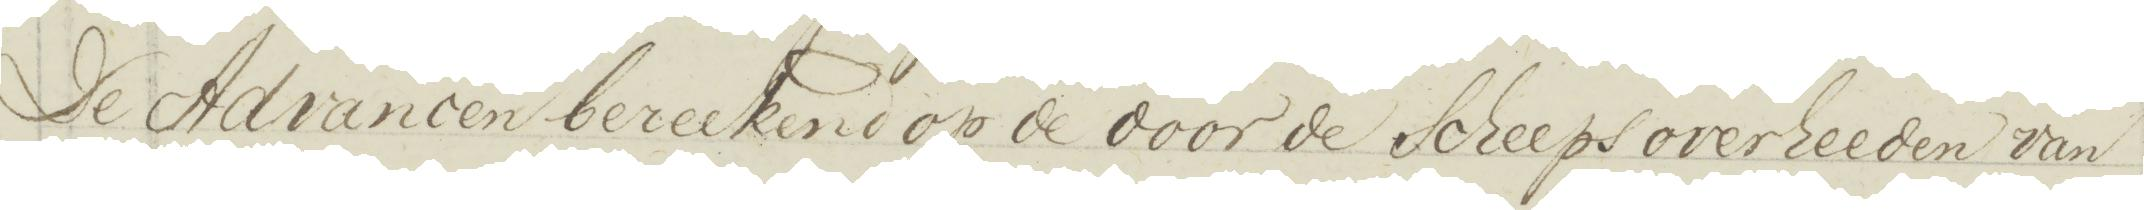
De Advancen bereekend op de door de scheeps overheeden van
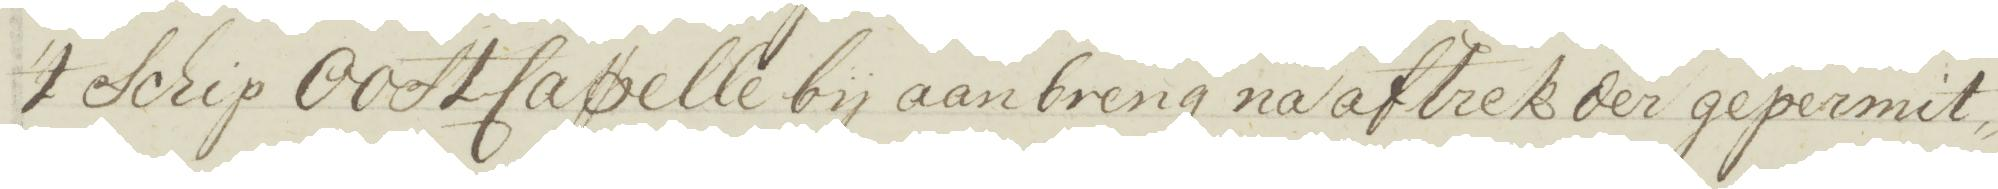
’t schip Oost Capelle bij aanbreng na aftrek der gepermit„
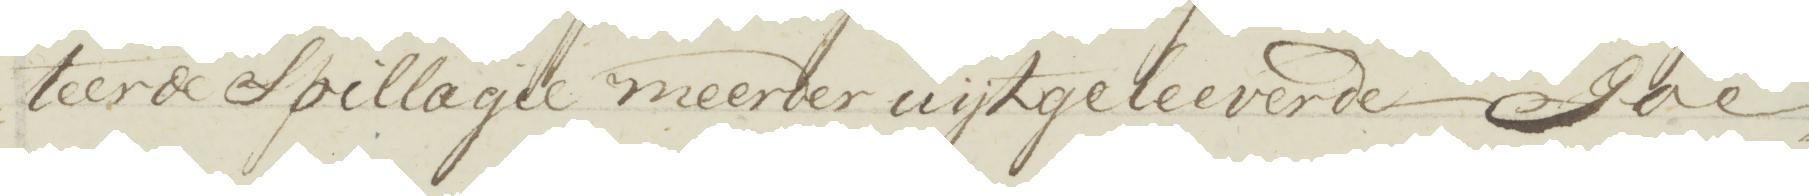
teerde spillagie meerder uijtgeleeverde Goe
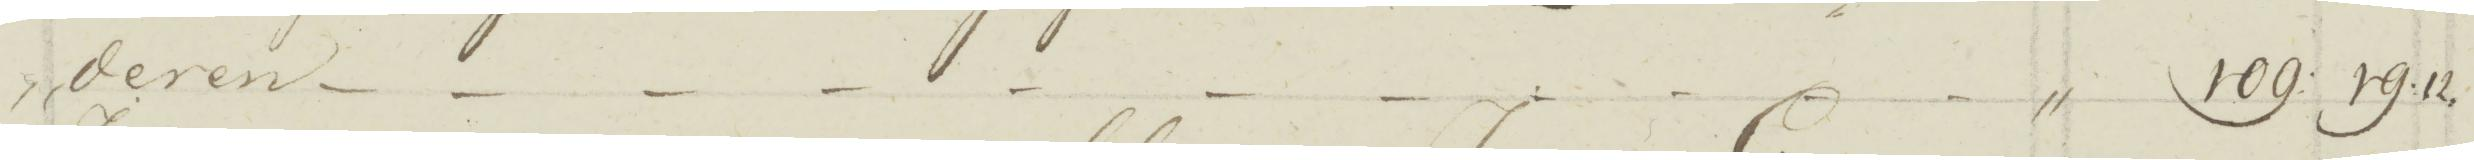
„deren - - - - - - - - - - - „ 109:19:12.
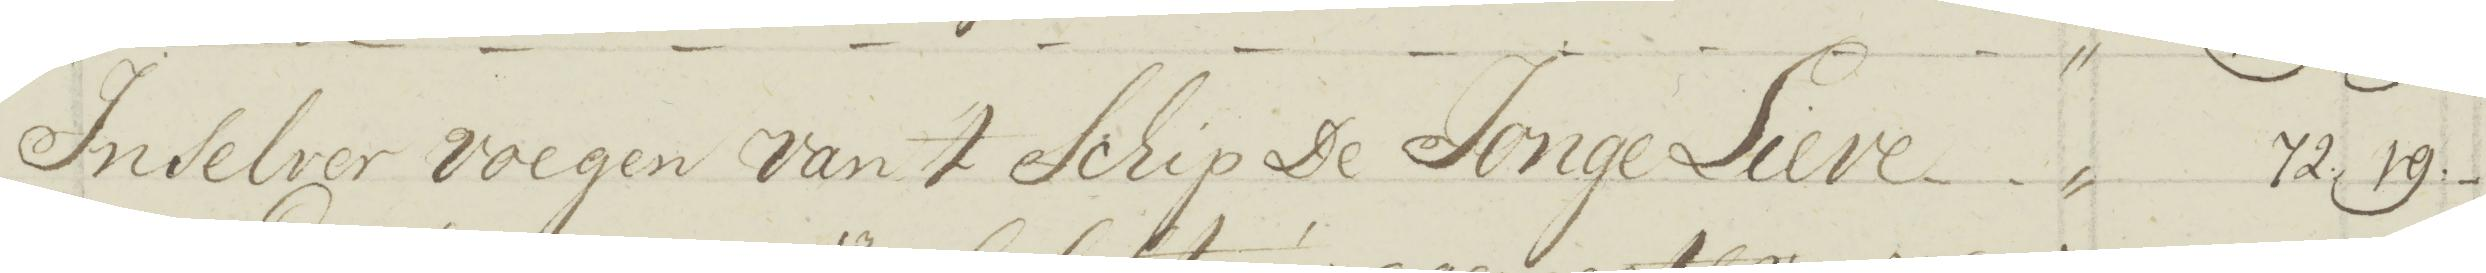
Inselver voegen van ’t schip De Ionge Lieve - - „ 72:19:_
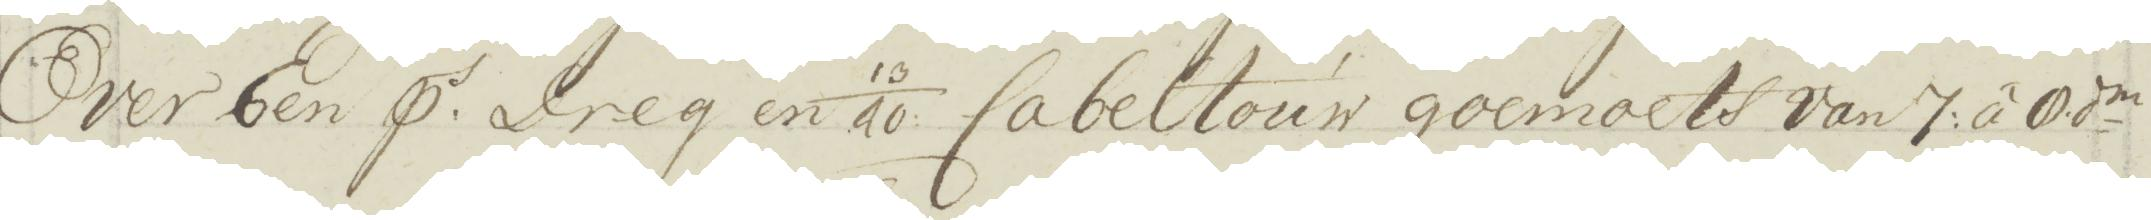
Over Een p:s Dreg en 13/40: Cabeltouw goemoets van 7: â 8: d=m
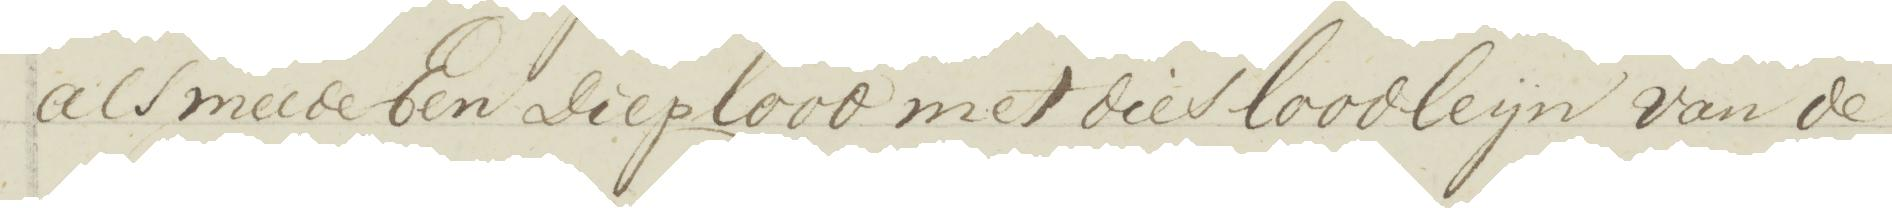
als meede Een Dieplood met dies loodleijn van de
